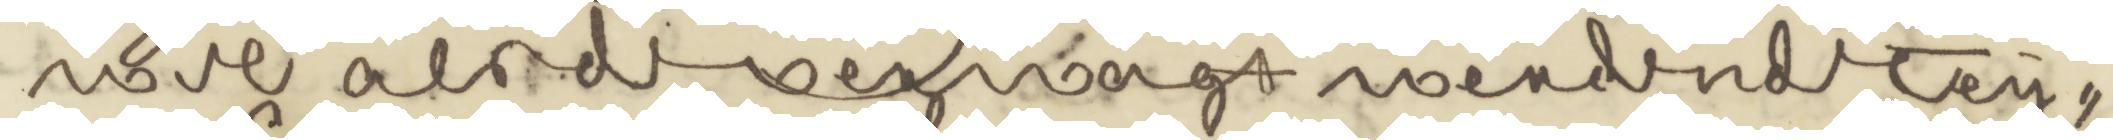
wel als de verwagt werdende Ceij„
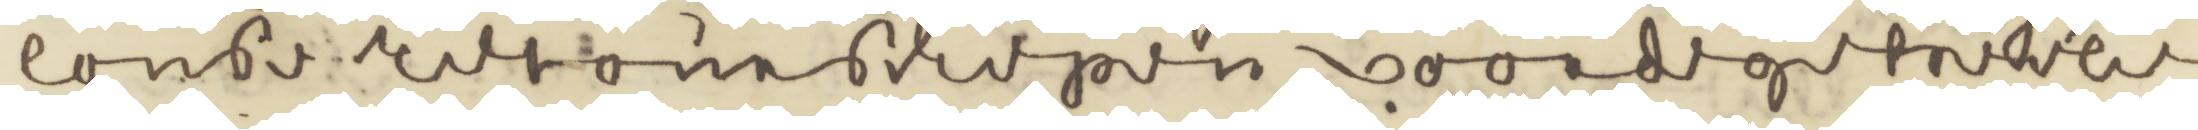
lonse retourschepen voor de geheele
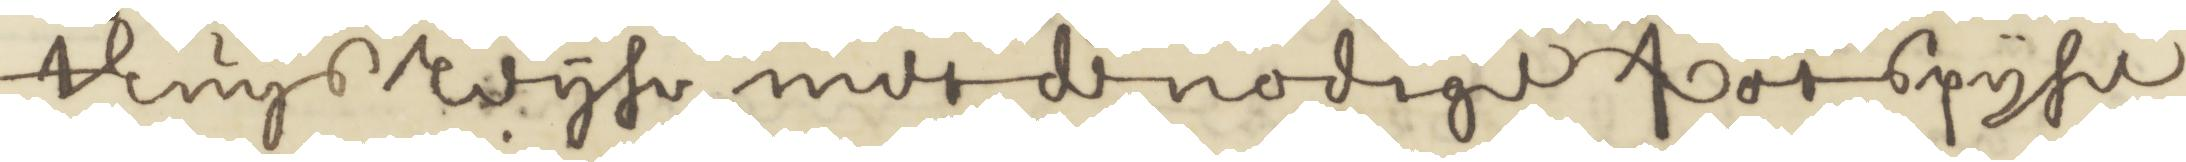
thuijs reijse met de nodige potspijse
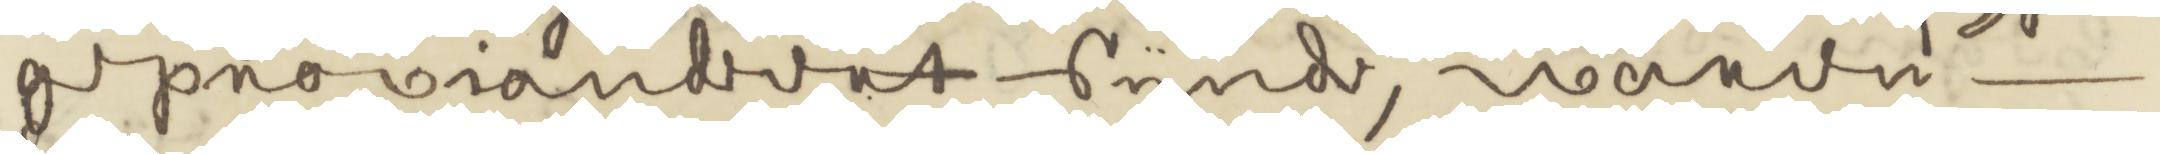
geproviandeert sijnde, waren —
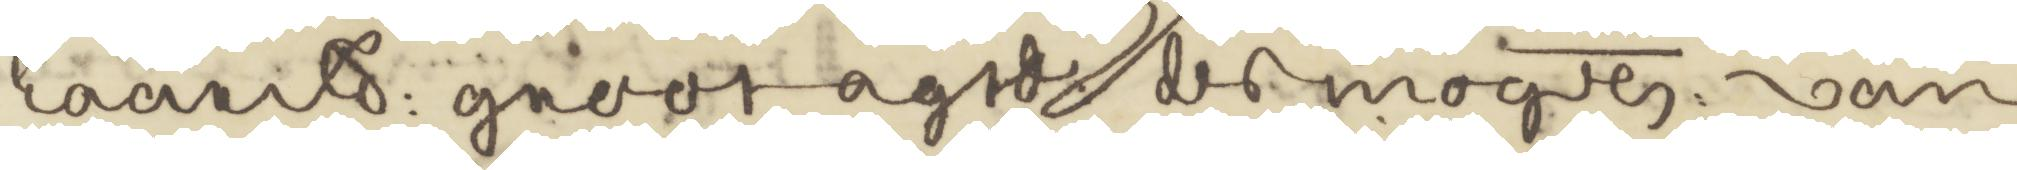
haarEd: groot agtb: des mogelijk van
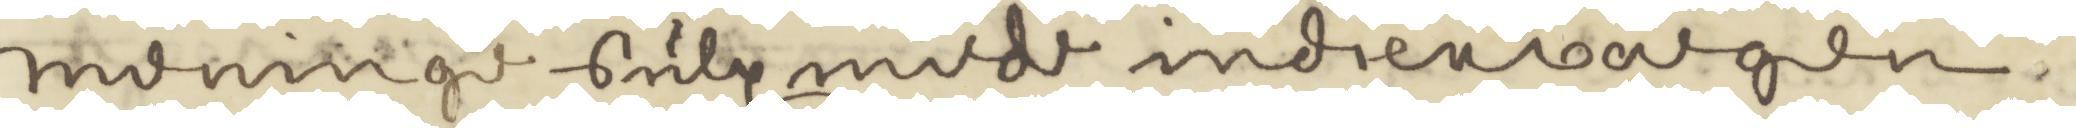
meninge sulx mede indiervoegen
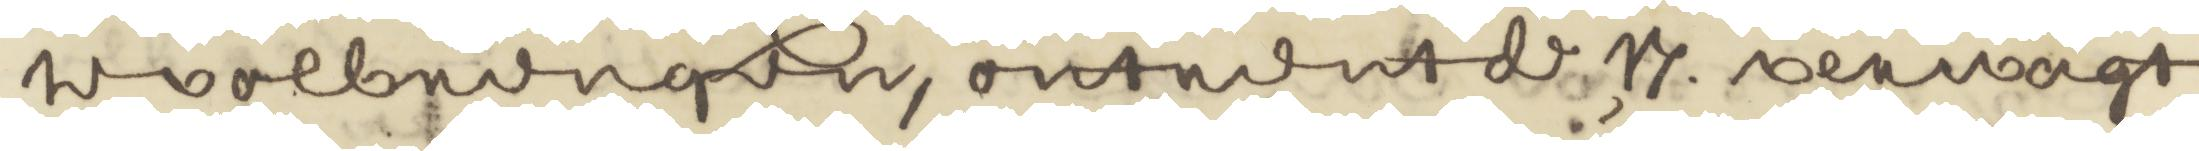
te volbrengen, ontrent de 17. verwagt
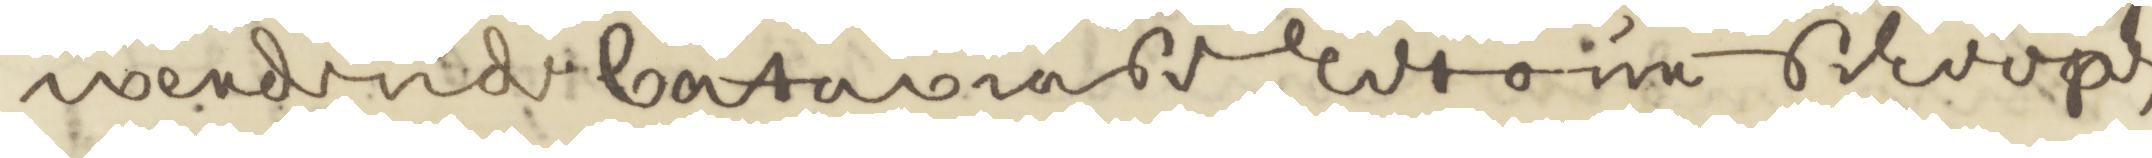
werdende bataviase retour scheepen
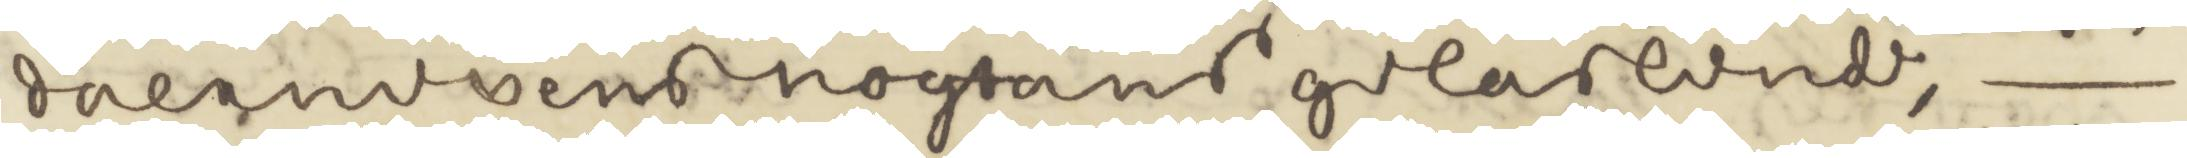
daernevens nogtans gelastende, —
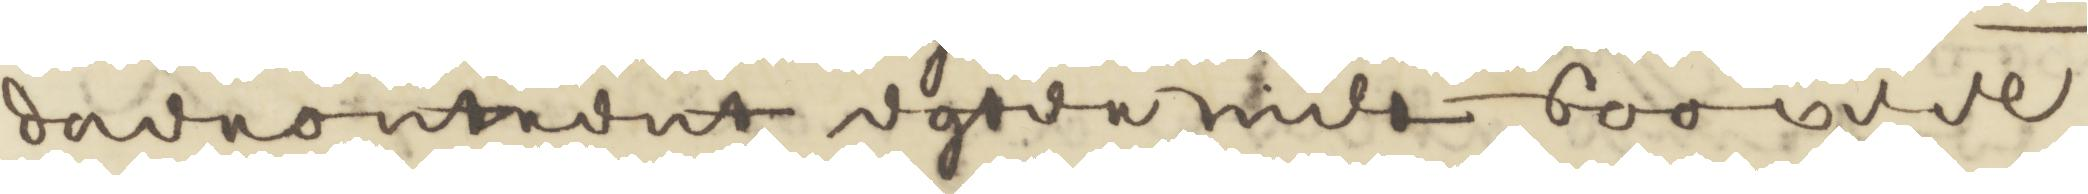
daerontrent egter met sooveel
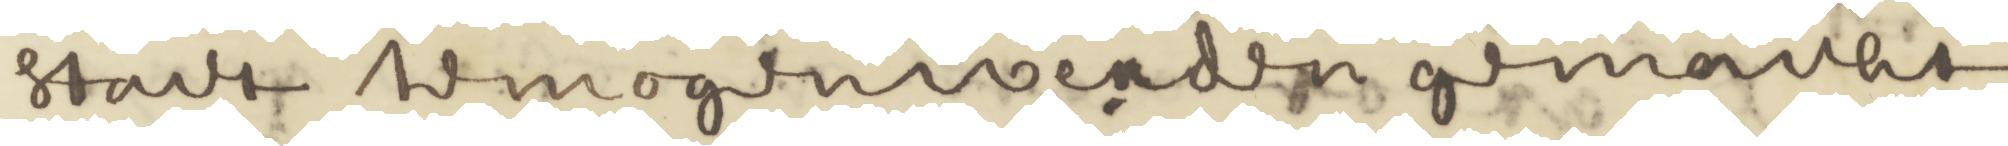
staet te mogen werden gemaekt
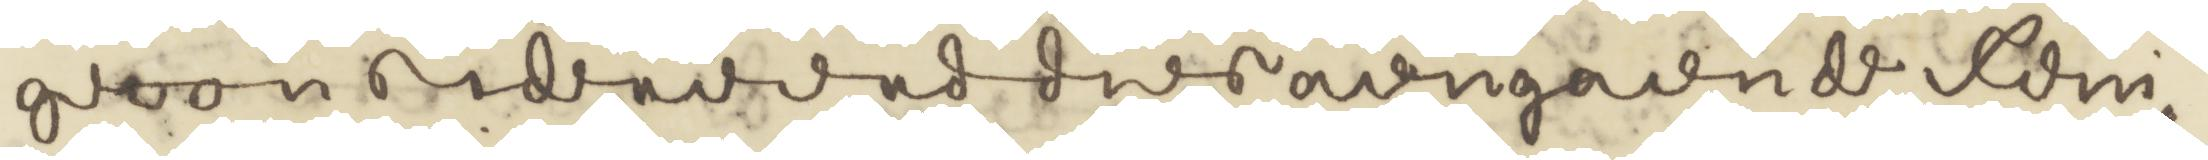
geconsidereerd dies aengaende Eeni„
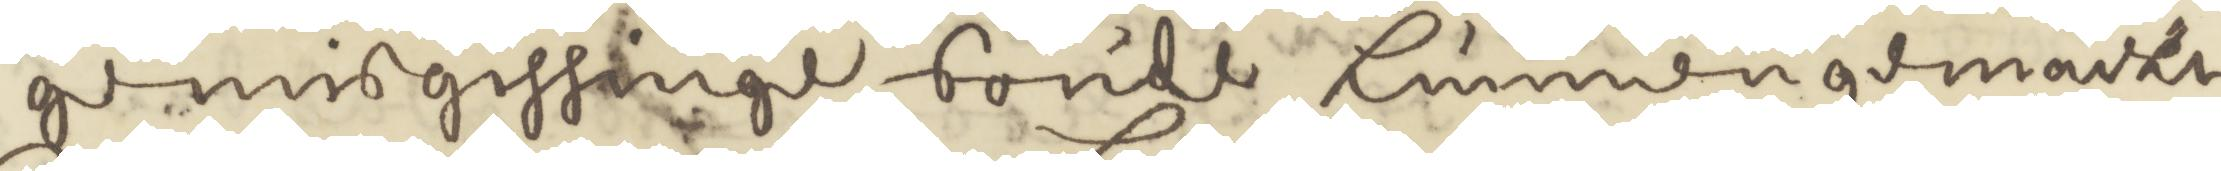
ge misgissinge soude kunnen gemaekt
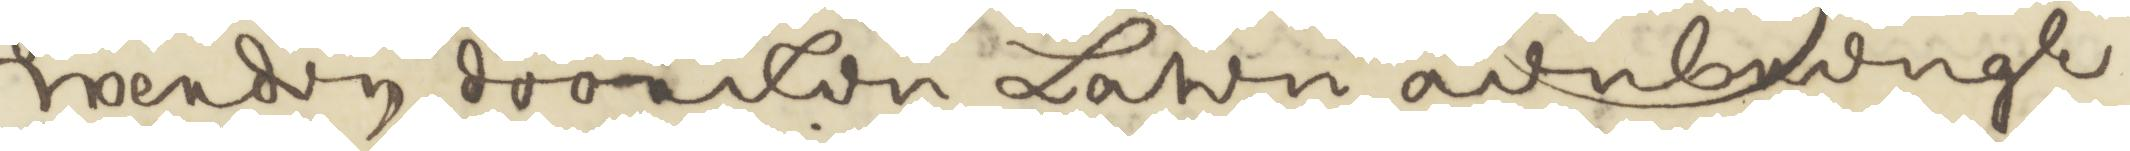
werden door Een Laten aenbrengh
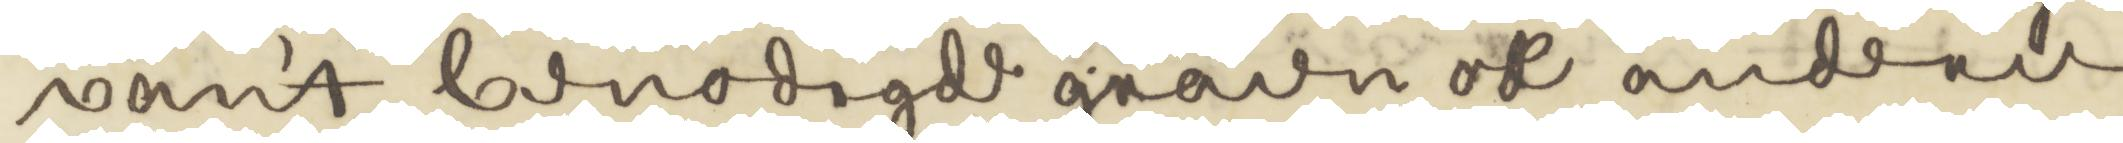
van’t benodigde graen of andere
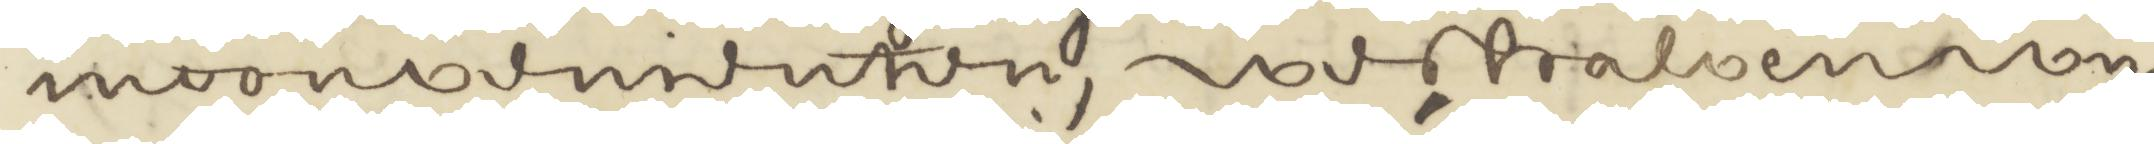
inconvenienten, weshalven wij
